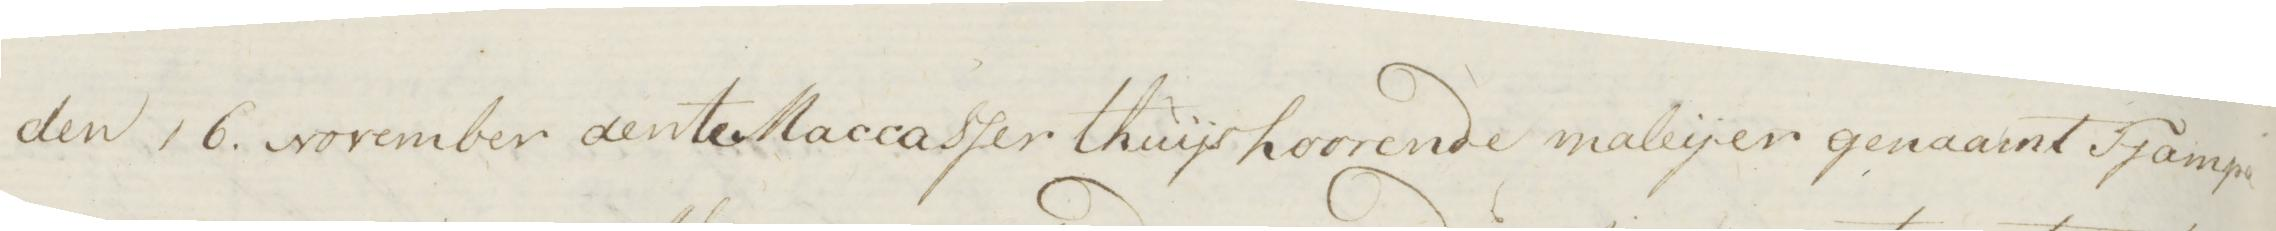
den 16. november dente Maccasser thuijs hoorende maleijer genaamt Tjampo
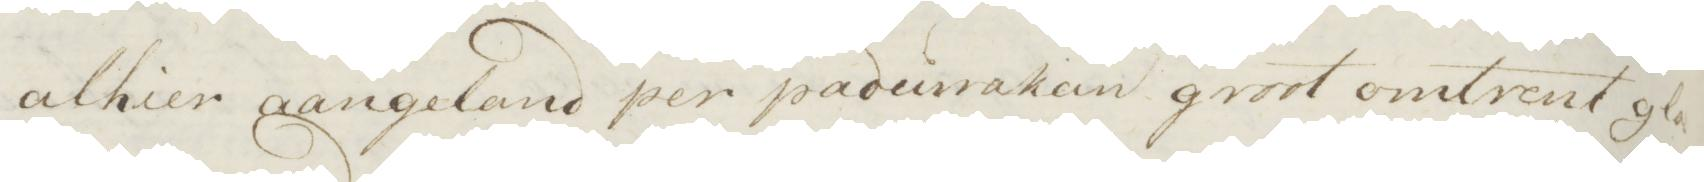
alhier aangeland per paduwakan groot omtrent 9 lo
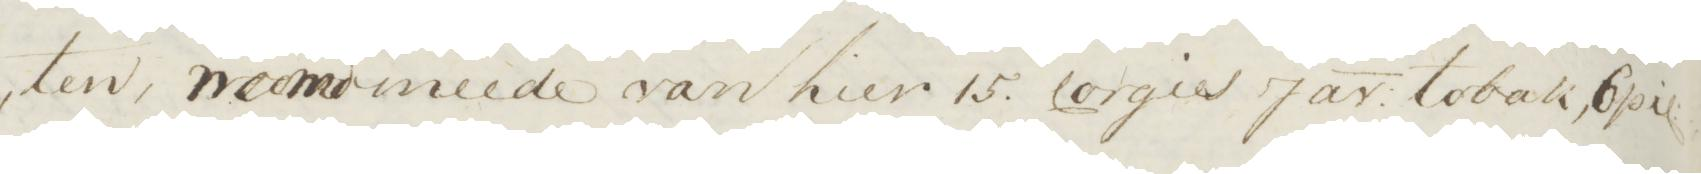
ten, neemdmeede van hier 15. Corgies jav: tobak, spic:
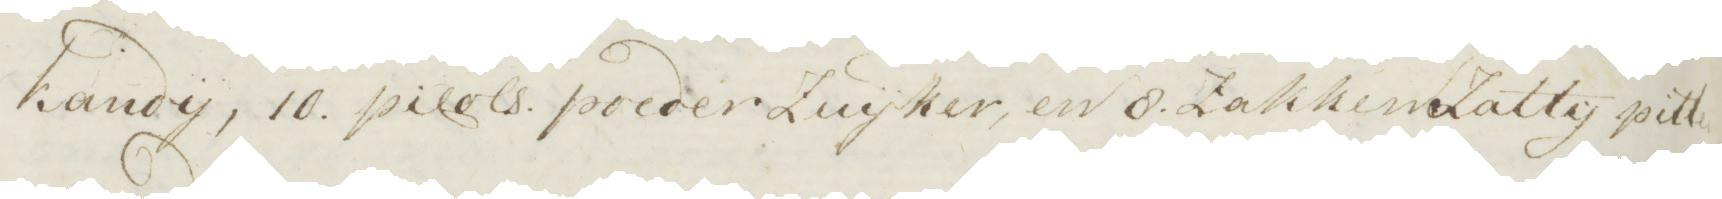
kandij, 10. picols. poeder zuijker, en 8. zakken zattij pitten
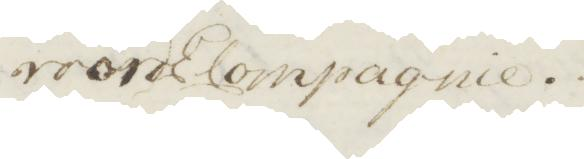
voor d E Compagnie.
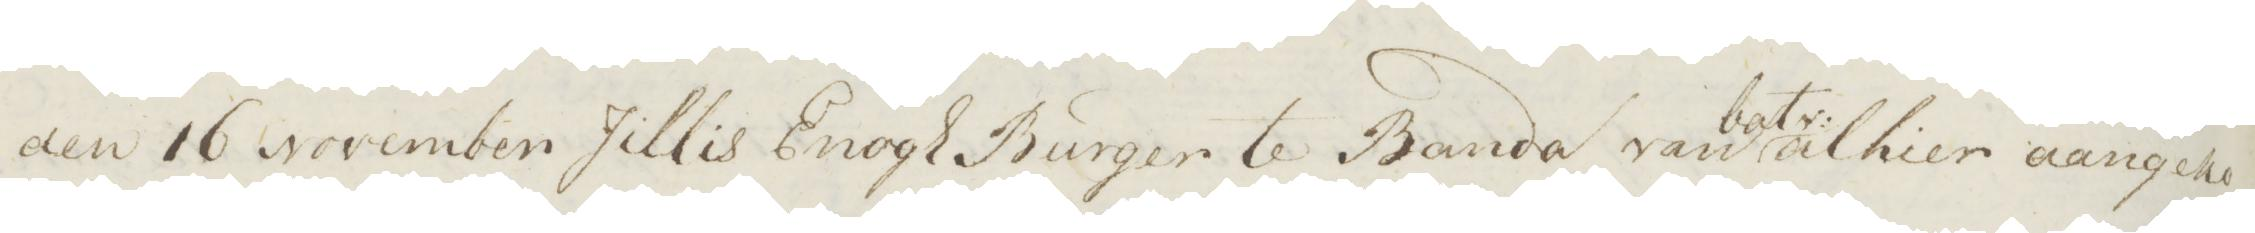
den 16 november Jillis Enogh Burger te Banda van batv: alhier aangeko
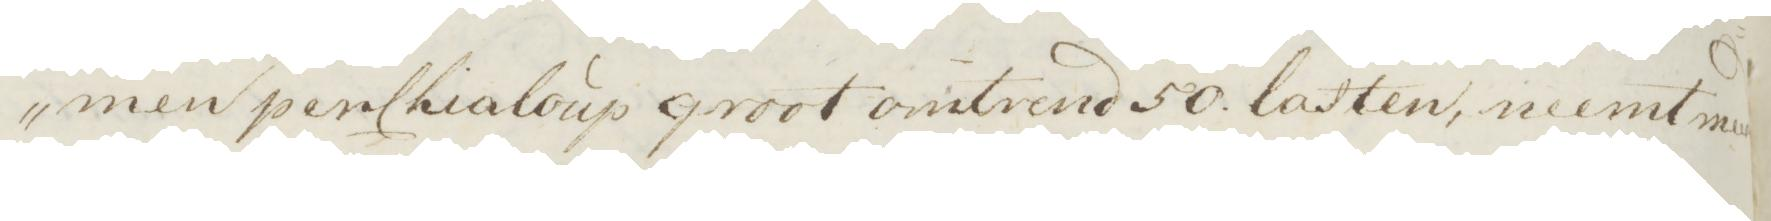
„men per Chialoup groot omtrend 50. lasten, neemt men
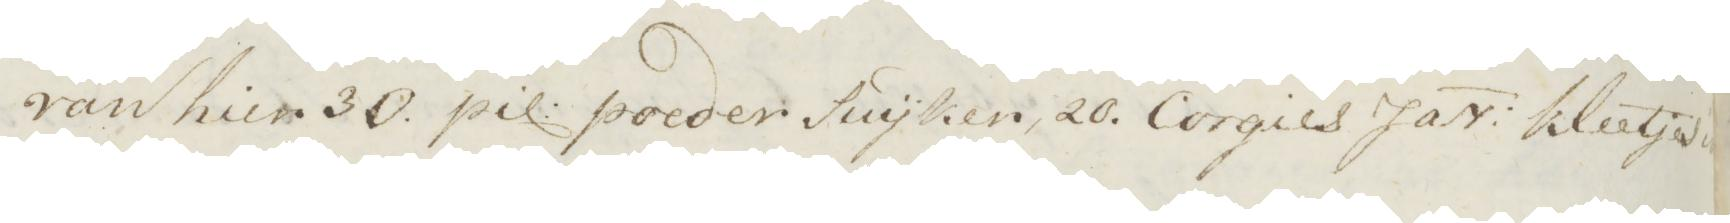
van hier 30. pic: poeder suijker, 20. Corgies jav: kleetjes en
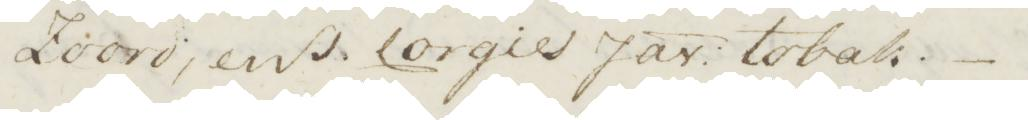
zoord, en 1. Corgies jav: tobak. —
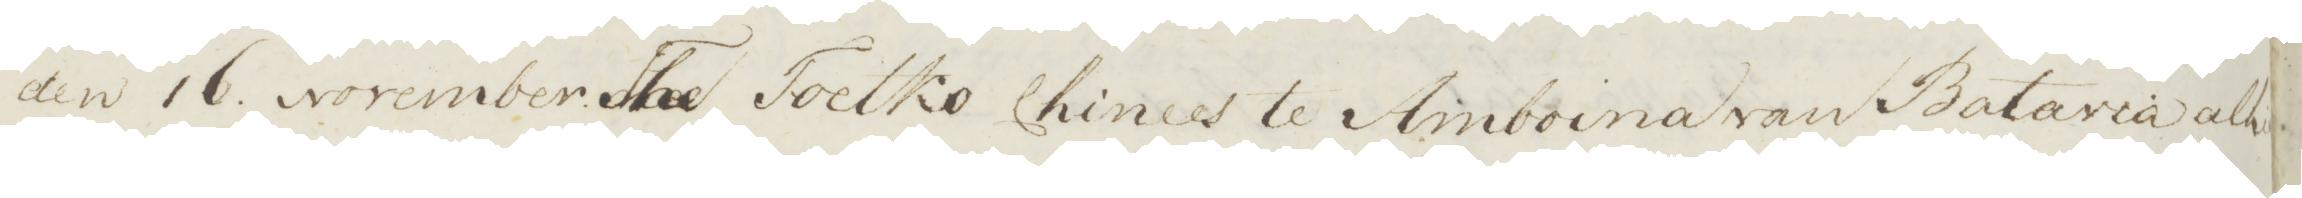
den 16. november The Toetko Chinees te Amboina van Batavia alhi
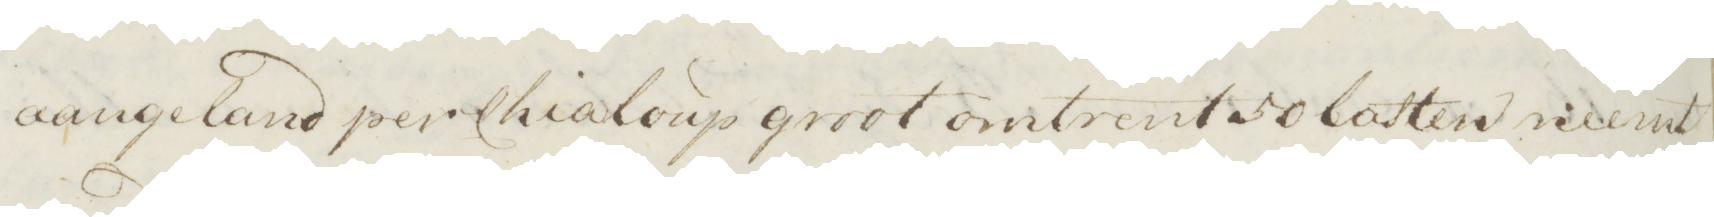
aangeland per Chialoup groot omtrent 50 lasten neemt
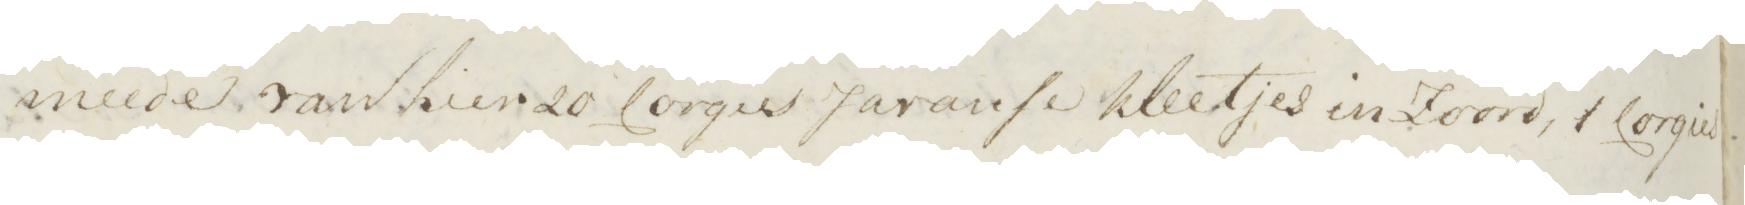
meede van hier 20 Corgies javanse kleetjes in Zoord, 1 Corgies
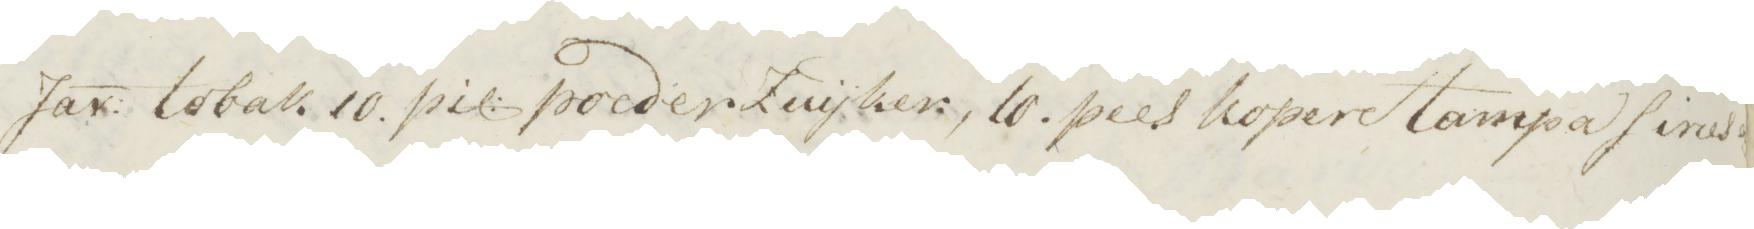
jav: tobat 10. pic: poeder zuijker, 10. pees kopere tampa sinese
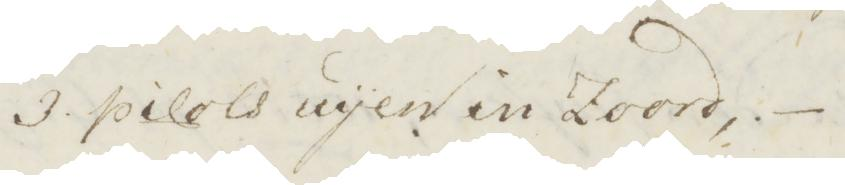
3. picols uijen in Zoord,. —
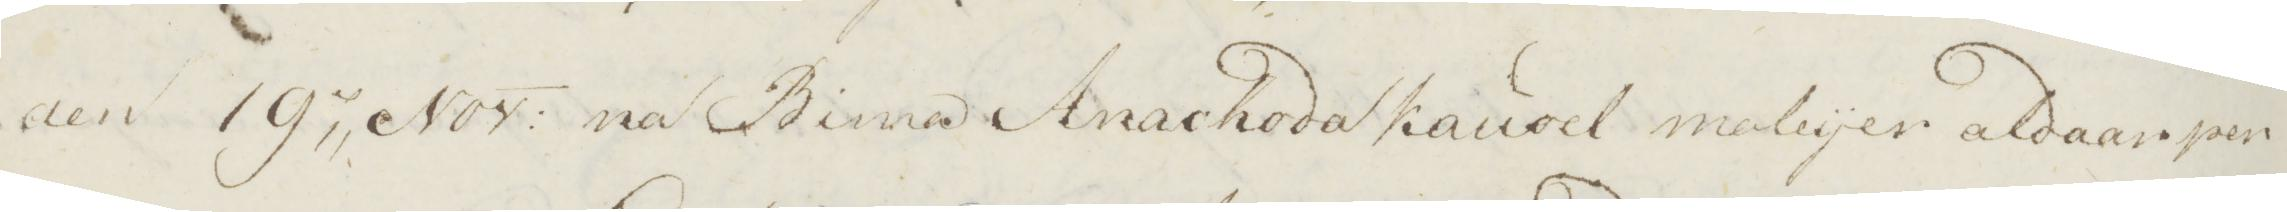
den 19„e Nov: na Bima Anachoda kauoel maleijer aldaar per
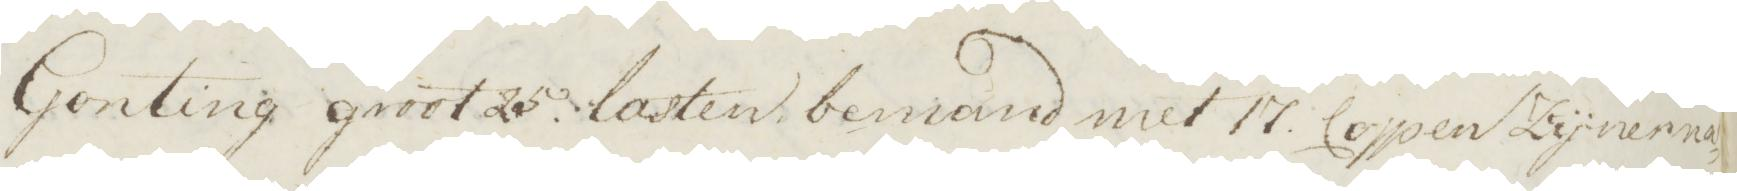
Gonting groot 25. lasten bemand met 17. Coppen zijner na„
